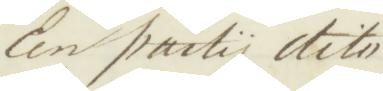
Een partij dito
